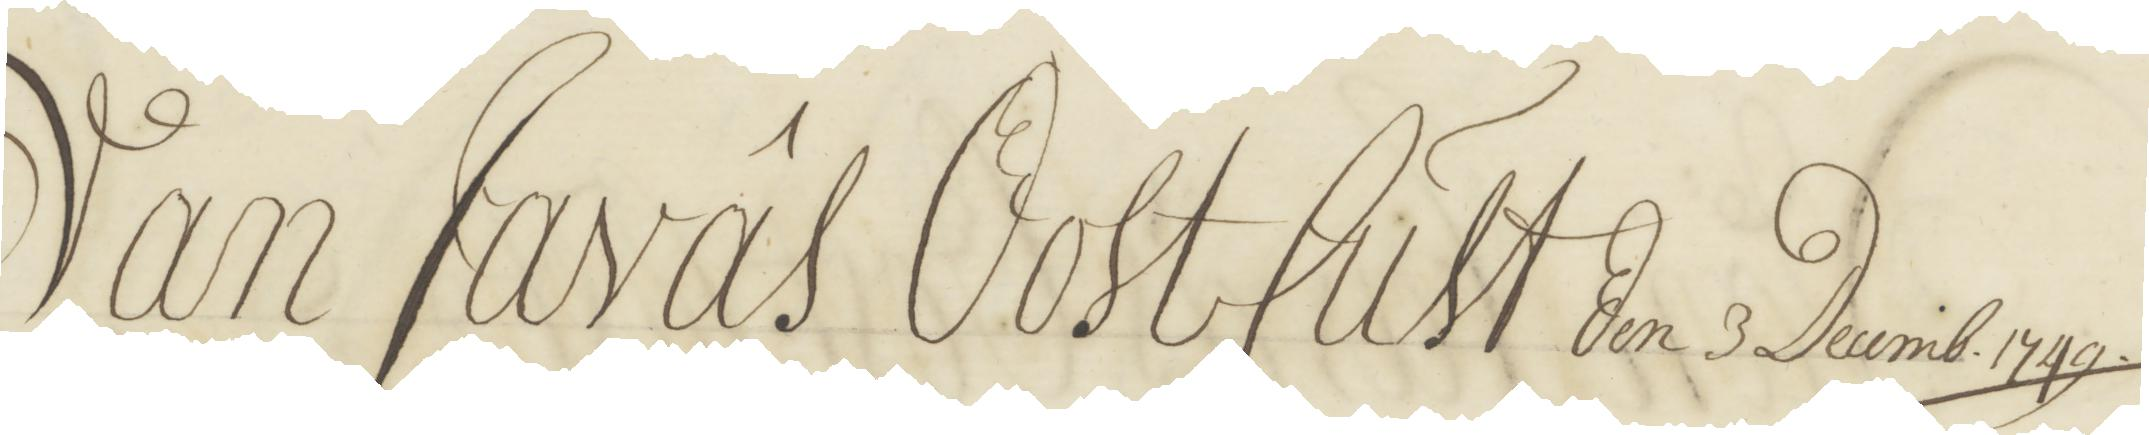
Van Javâs Oost Cust den 3 Decemb. 1749.
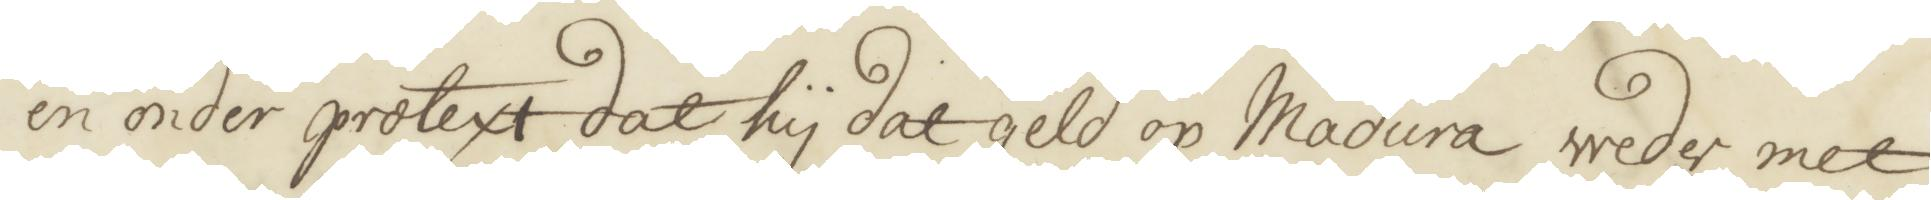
en onder pretext dat hij dat geld op Madura weder met
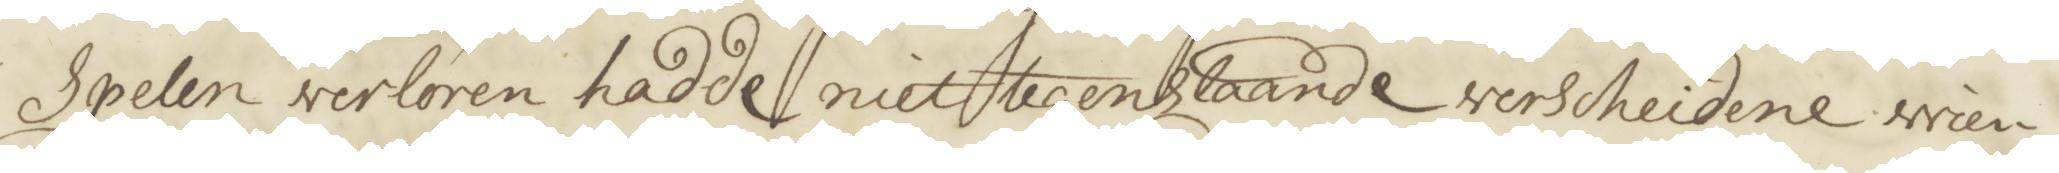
spelen verloren hadde niet tegenenstaande verscheidene vrien„
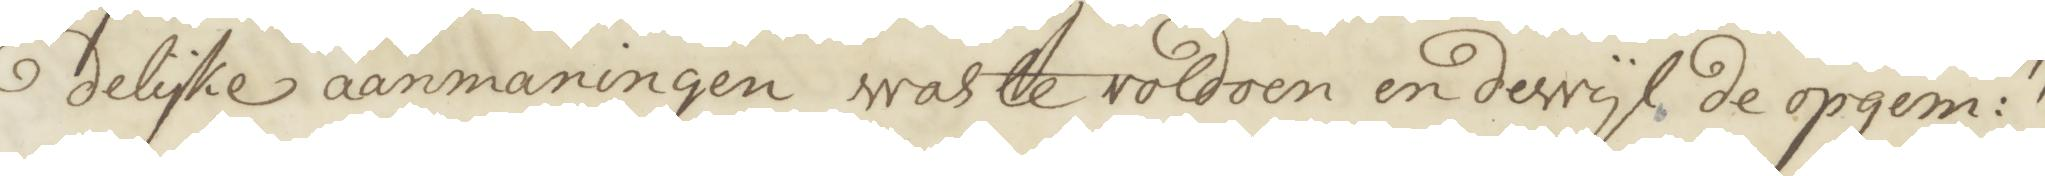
delijke aanmaningen was te voldoen en dewijl de opgem:
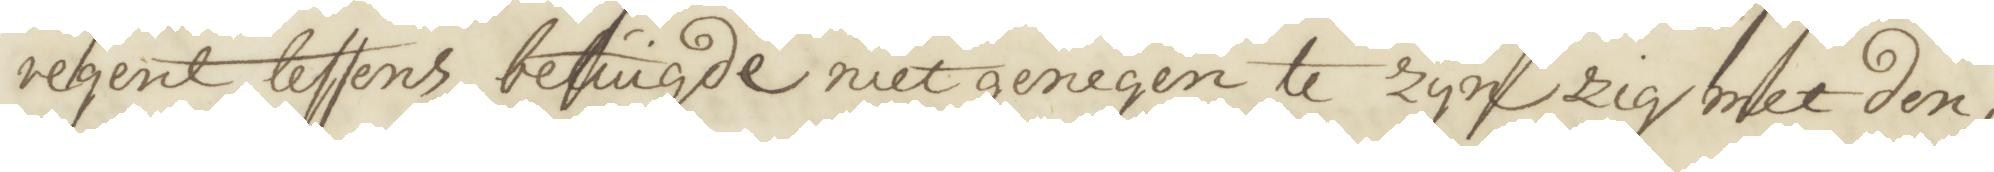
regent teffens betuigde niet genegen te zijn, zig met den
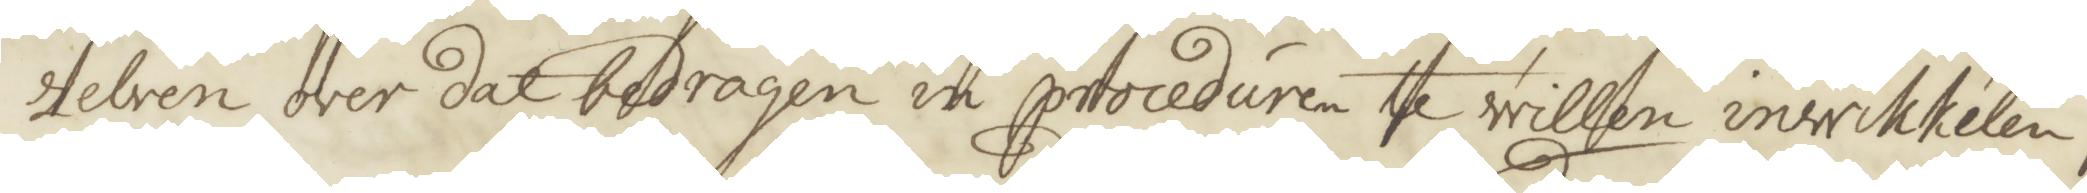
zelven over dat bedragen in proceduren te willen inwikkelen
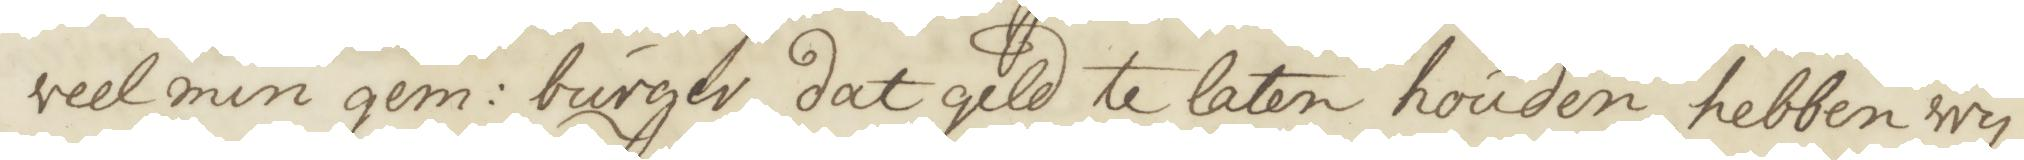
veel min gem: burger dat geld te laten houden, hebben wij
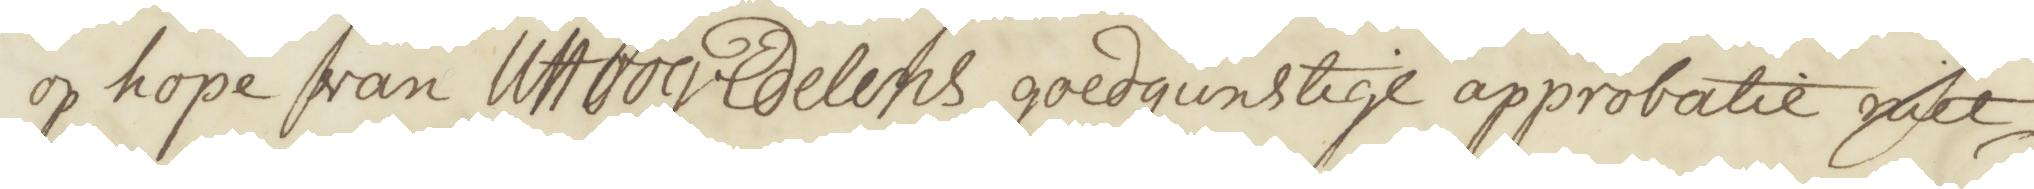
op hope van UHoog Edelens goedgunstige approbatie niet
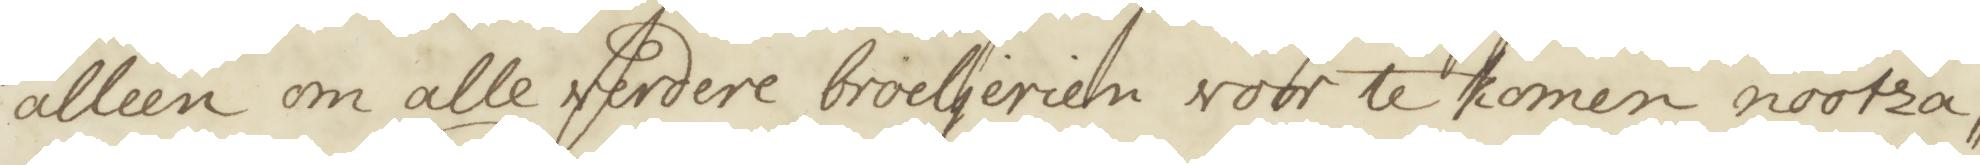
alleen om alle verdere broeljerien voor te komen nootza
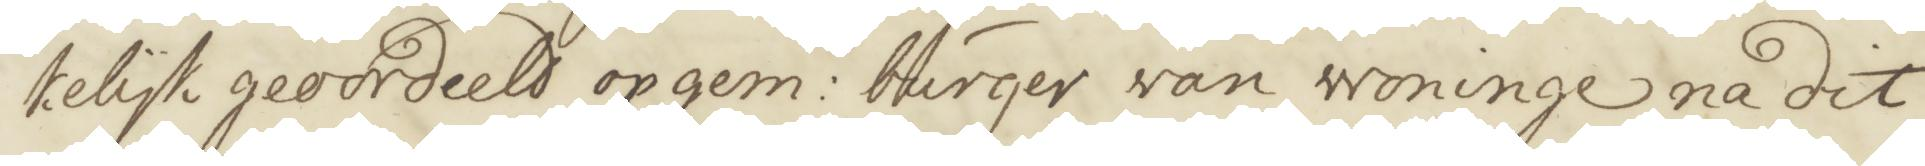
kelijk geoordeeld op gem: burger van woninge na dit
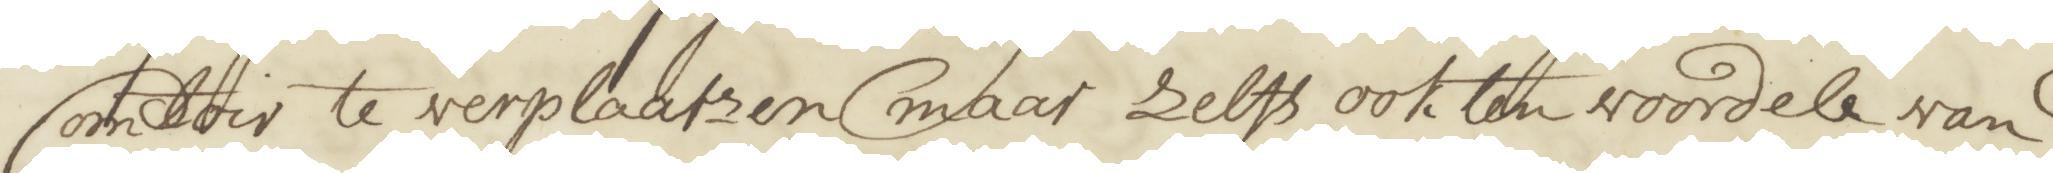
Comtoir te verplaatzen, maar zelfs ook ten voordele van
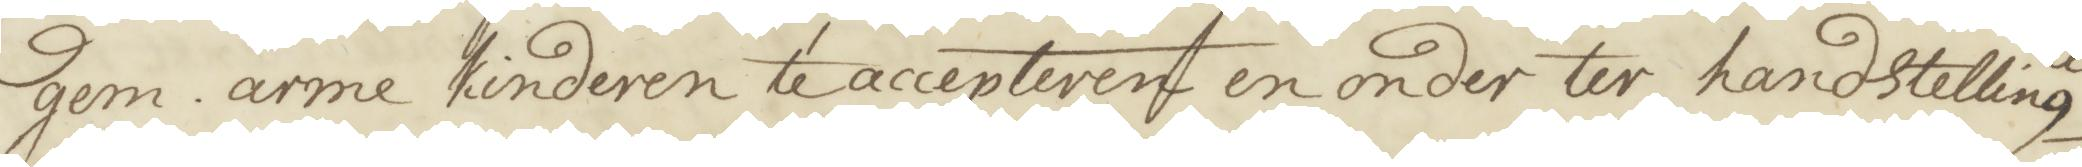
gem. arme kinderen te accepteren en onder ter handstelling
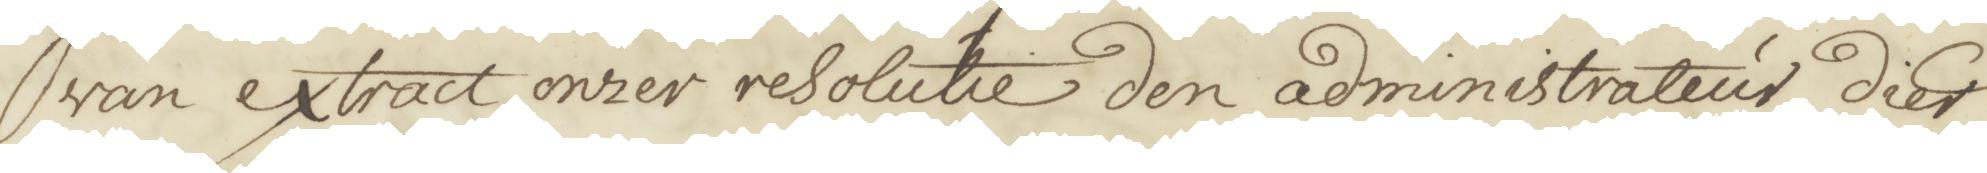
van extract onzer resolutie den administrateur dier
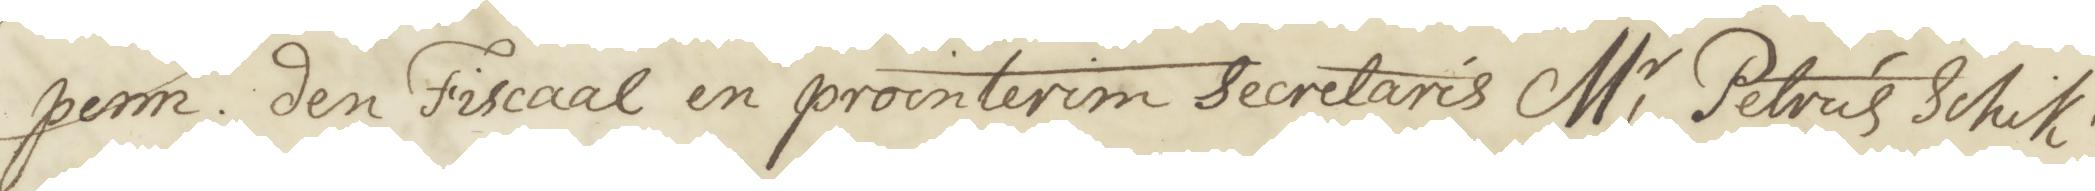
penn. den Fiscaal en prointerim secretaris M„r Petrus schik
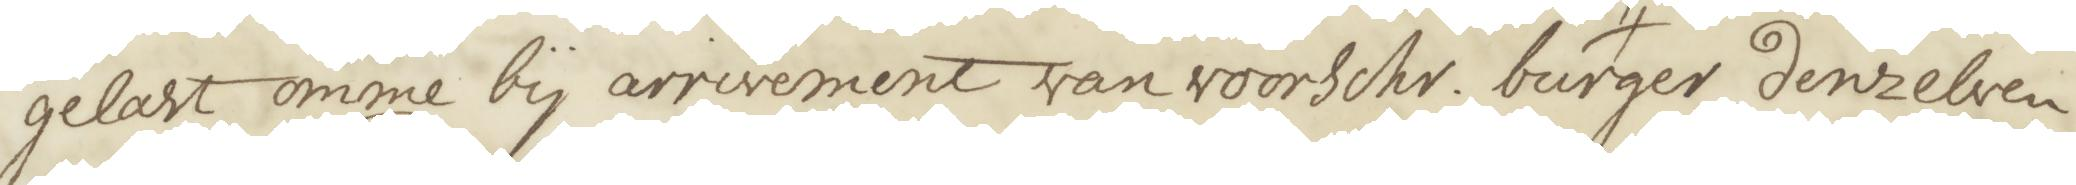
gelast omme bij arrivement van voorschr. burger denzelven
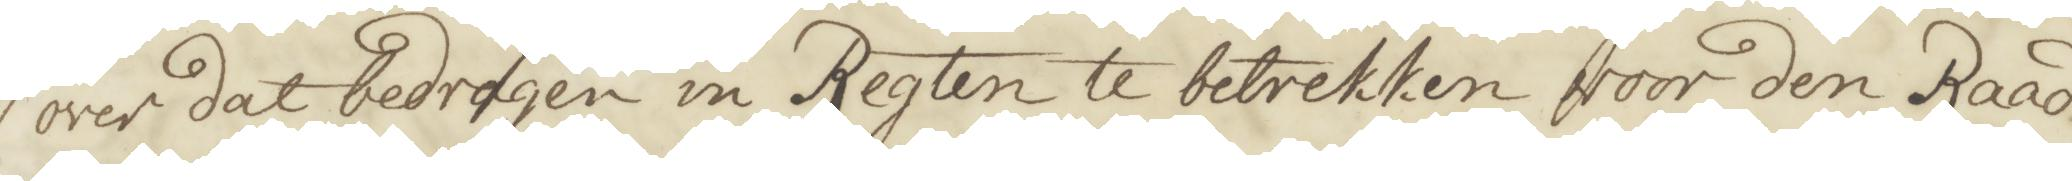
over dat bedragen in Regten te betrekken voor den Raad
